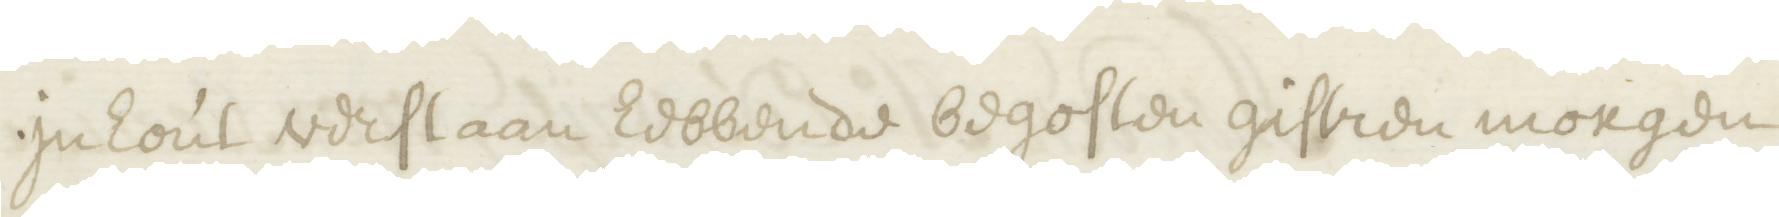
jnhout verstaan hebbende begosten gistren morgen
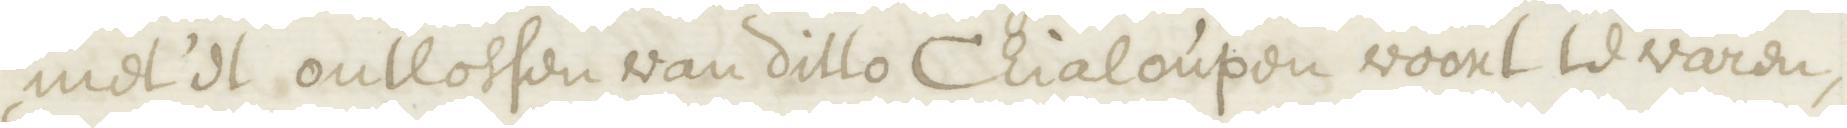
met'et ontlossen van ditto Chialoupen voort te varen,
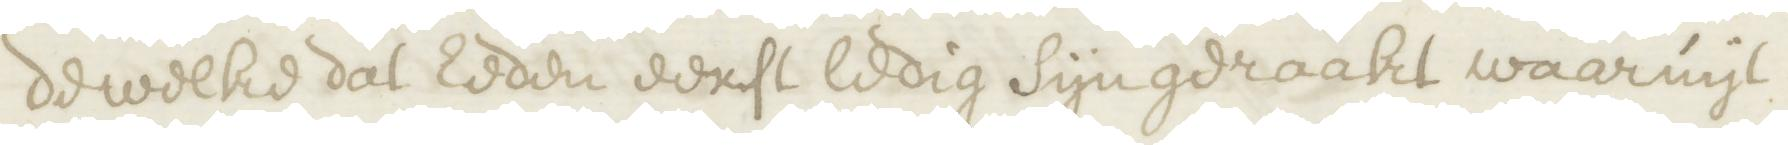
de welke dat heden eerst ledig sijn geraakt waaruijt
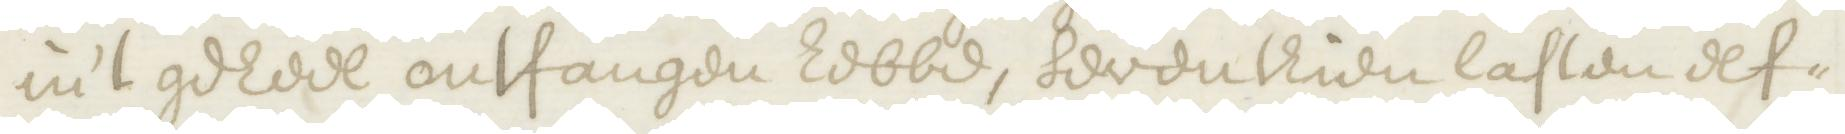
in’t geheel ontfangen hebbe, seven thien lasten elf„
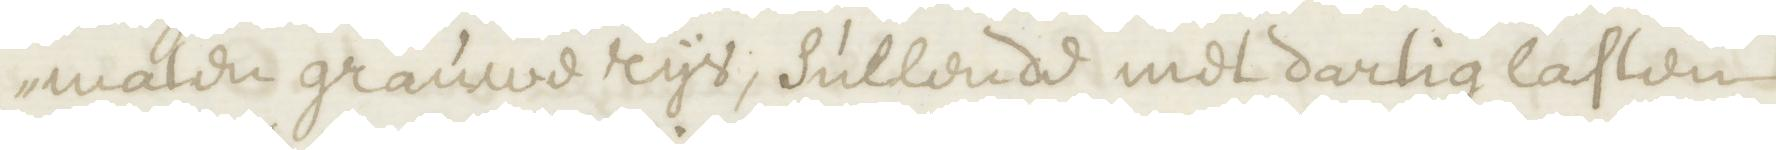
„maten grauwe rijs; sullende met dartig lasten
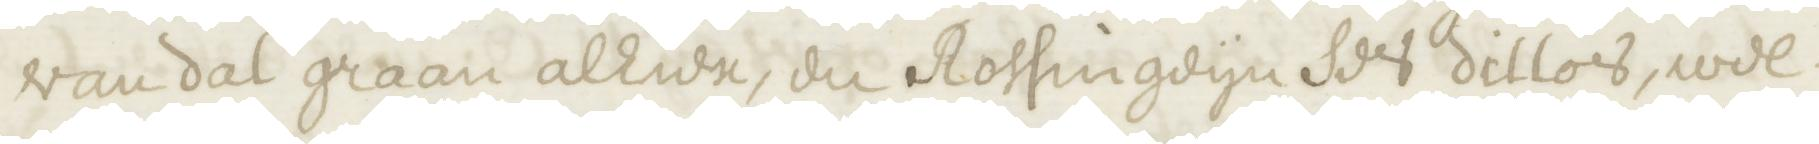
van dat graan alhier, en Rossingeijn ses dittos, wel
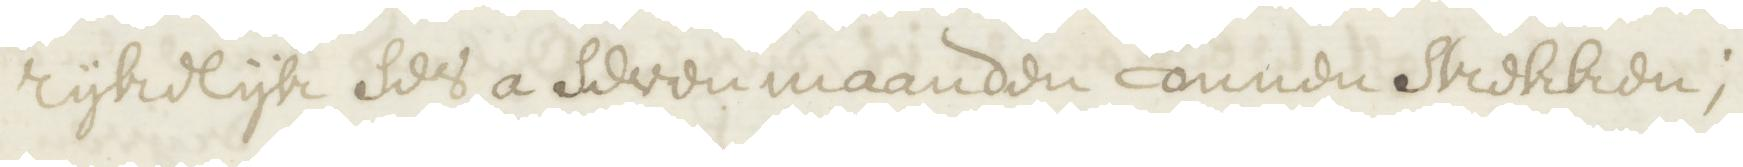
rijkelijk ses a seven maanden connen strekken;
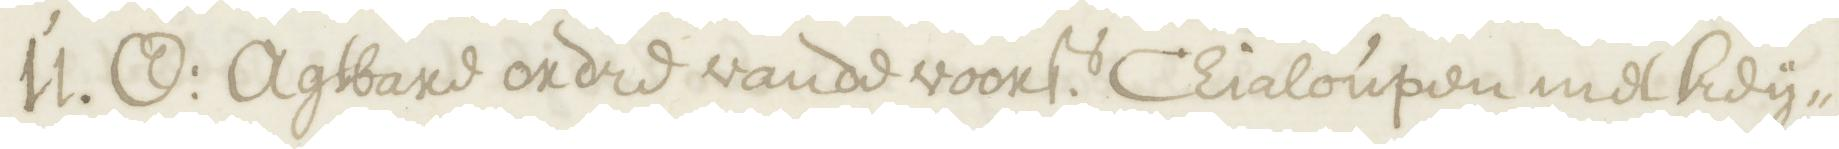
U. E: Agtbare ordre van de voors. Chialoupen met keij„
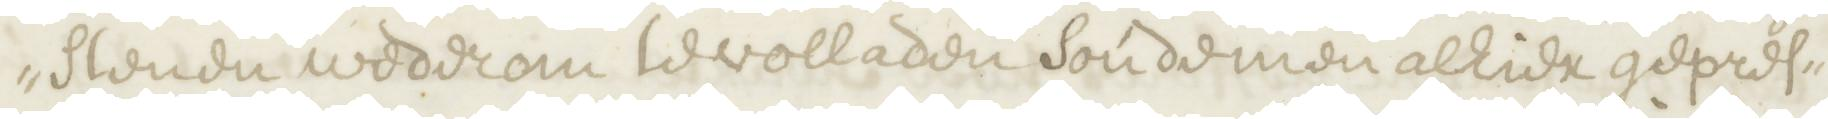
„stenen wederom tevolladen soudemen alhier gepres„
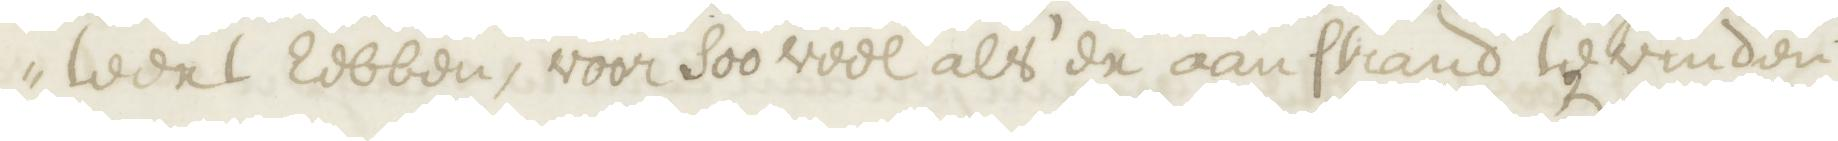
„teert hebben, voor soo veel als 'er aan strand te vinden
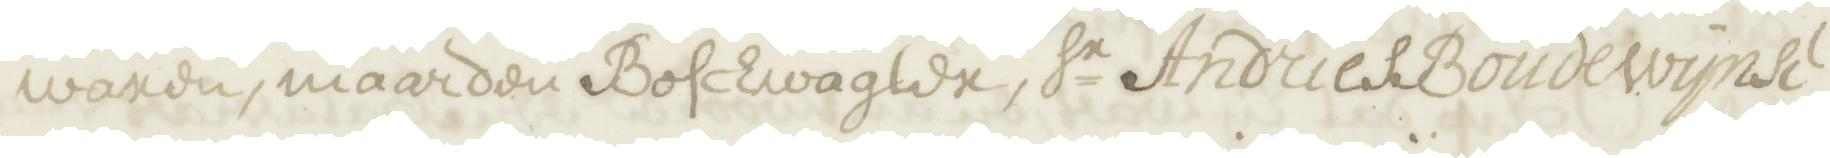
waren, maar den Boschwagter, s=r Andries Boudewijnse
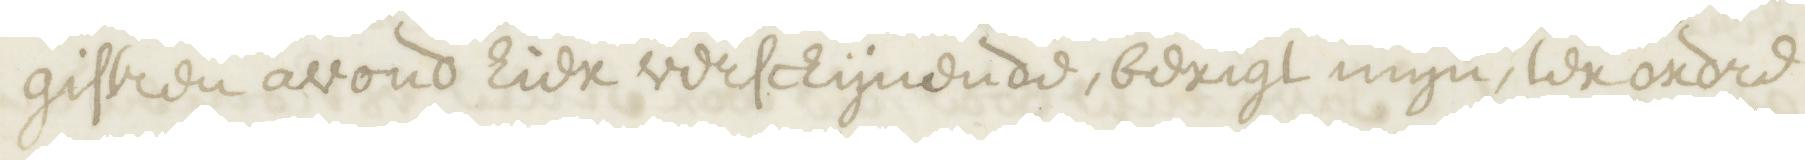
gistren avond hier verschijnende, berigt mijn, ter ordre
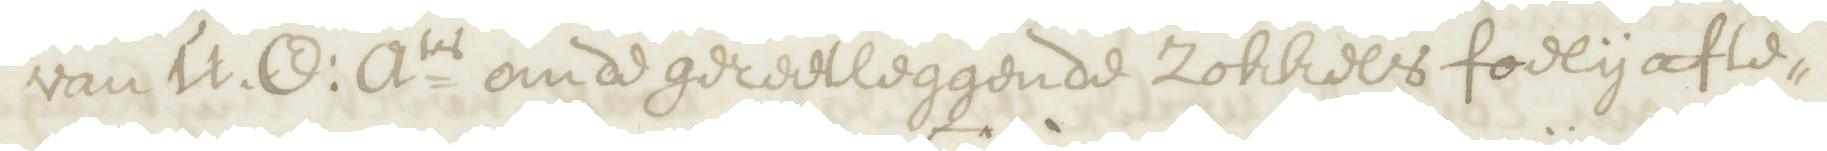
van U. E: A=res om de gereetleggende zokkels foelij afte„
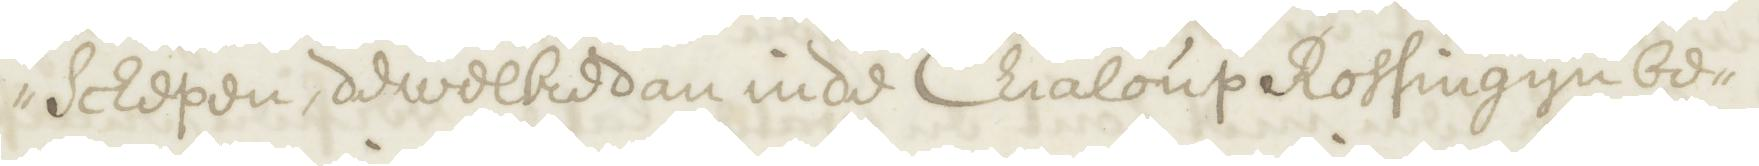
„schepen, dewelke dan in de Chialoup Rossingijn be„
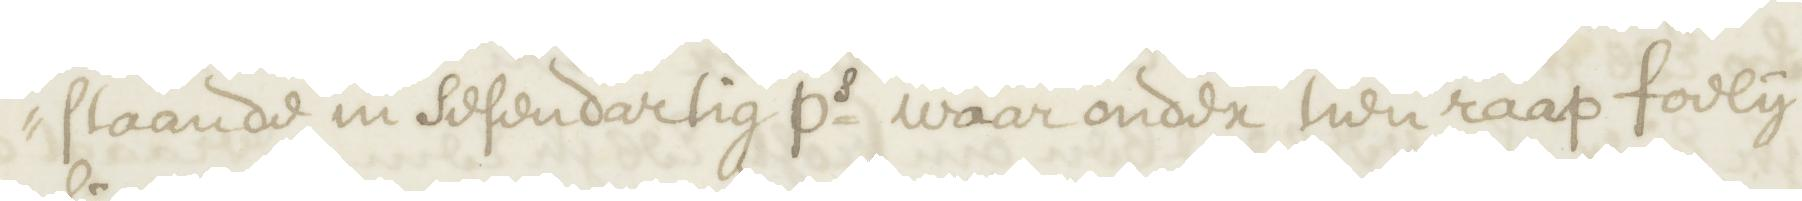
„staande in sesendartig p=s waar onder tien raap foelij
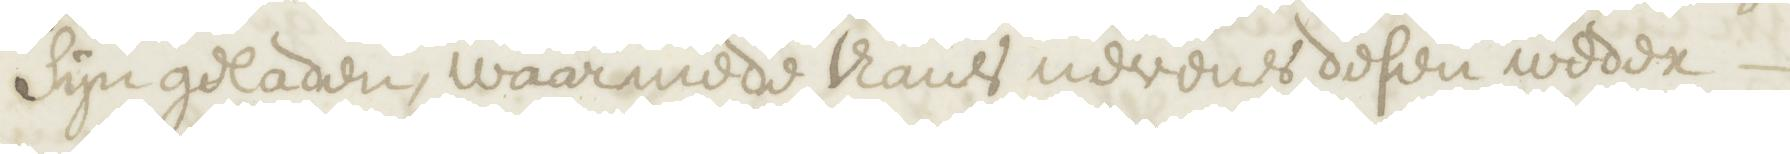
sijn geladen, waarmede thans nevens desen weder —
